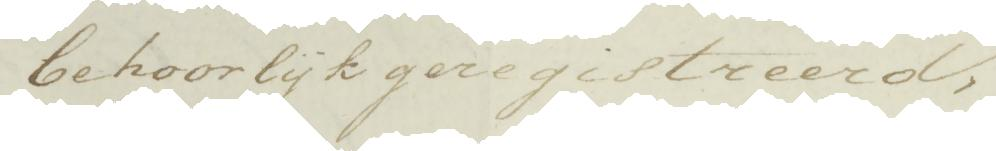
behoorlijk geregistreerd,
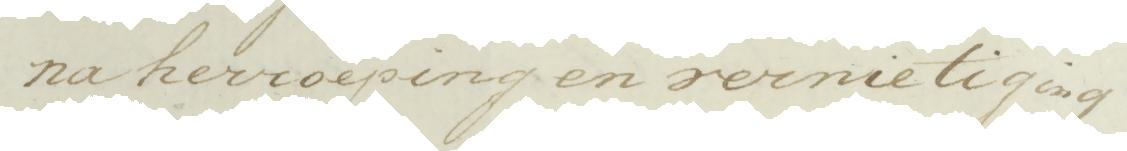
na herroeping en vernietiging
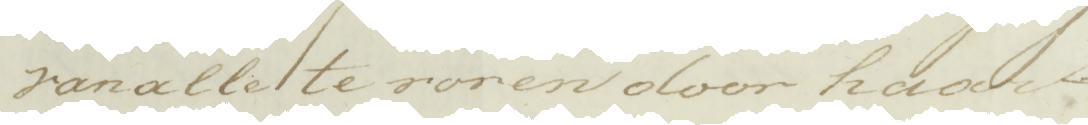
van alle te voren door haar
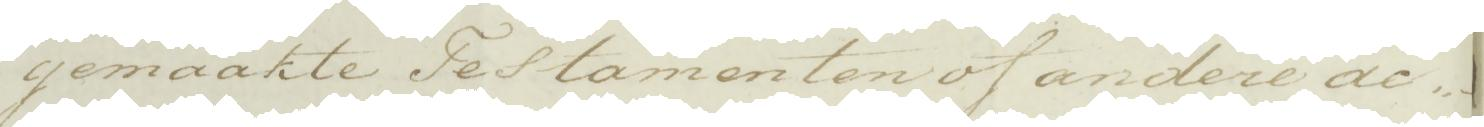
gemaakte Testamenten of andere ac„
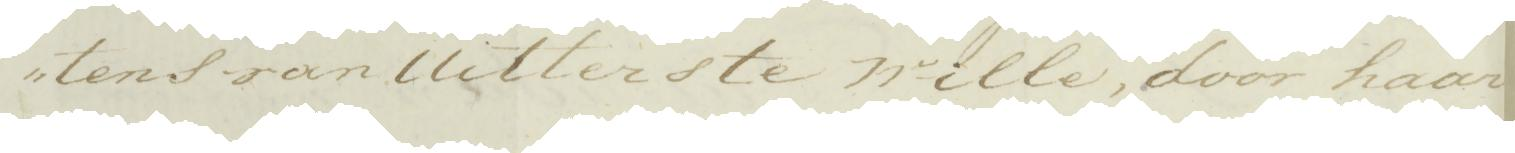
„tens van Uitterste Wille, door haar
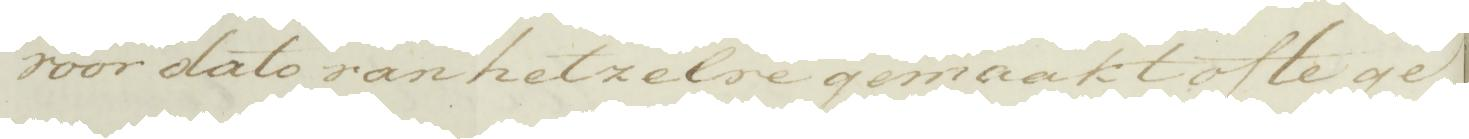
voor dato van hetzelve gemaakt ofte ge
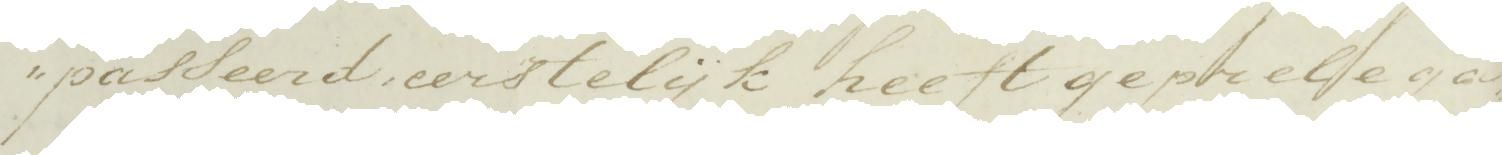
„passeerd, eerstelijk heeft geprelega
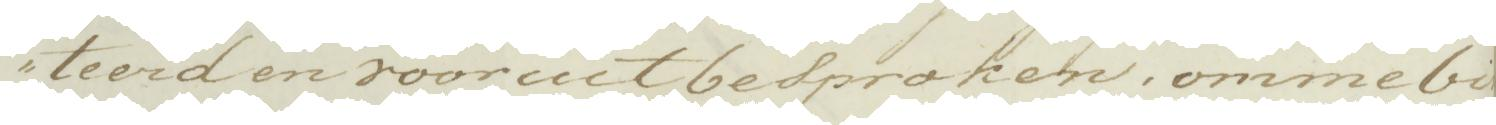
„teerd en vooruit besproken, omme bi
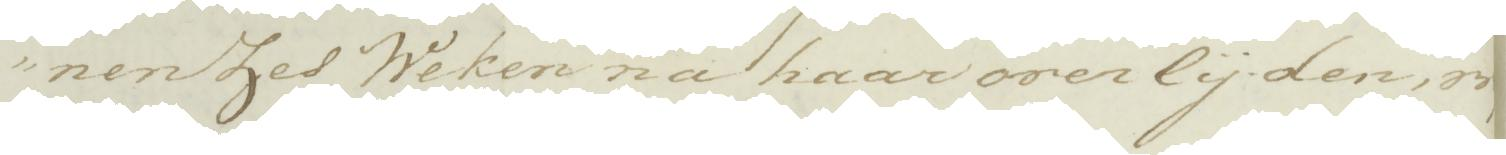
„nen Zes Weken na haar overlijden,
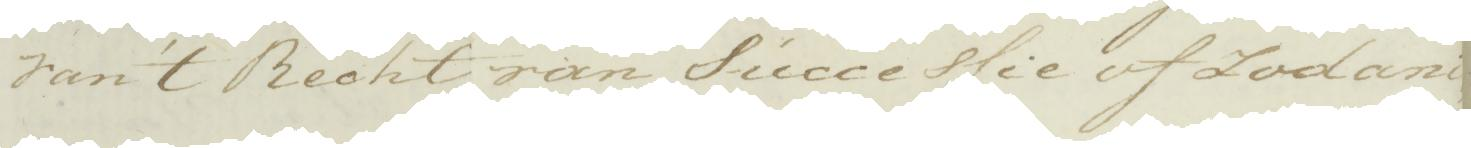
van ’t Recht van Successie of zodani
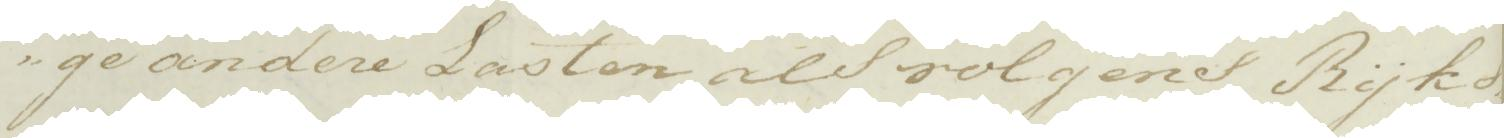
„ge andere Lasten, als volgens Rijk
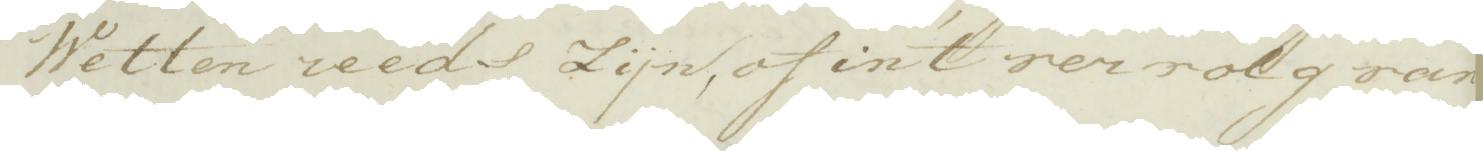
Wetten reeds zijn, of in ’t vervolg van
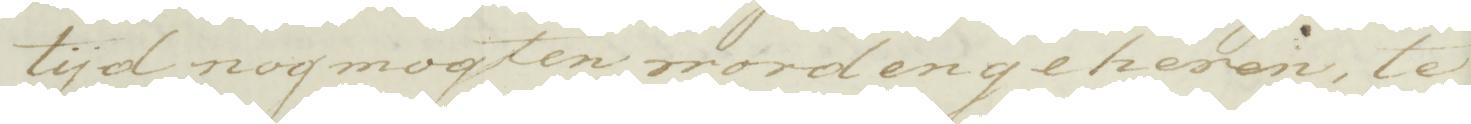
tijd nog mogten worden geheven, te
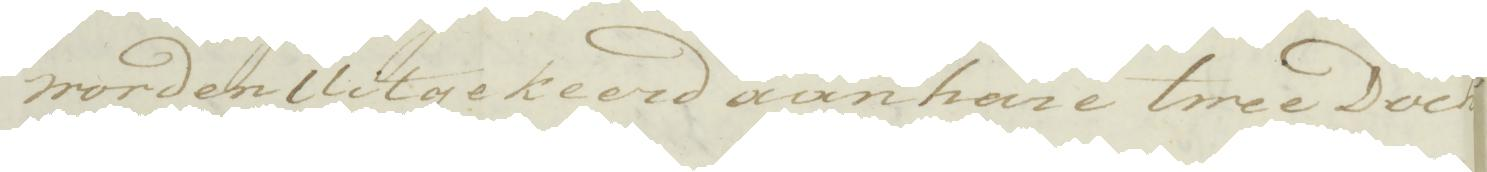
worden uitgekeerd aan hare twee Doch
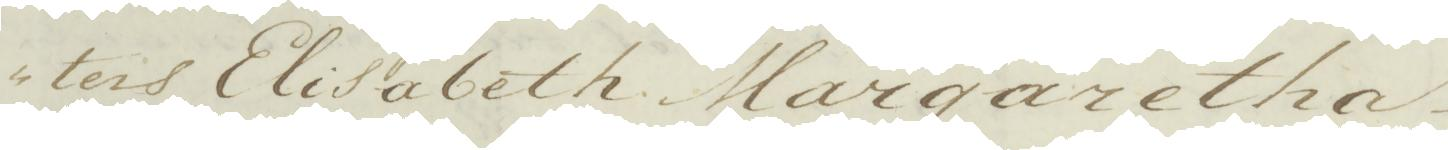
„ters Elisabeth Margaretha
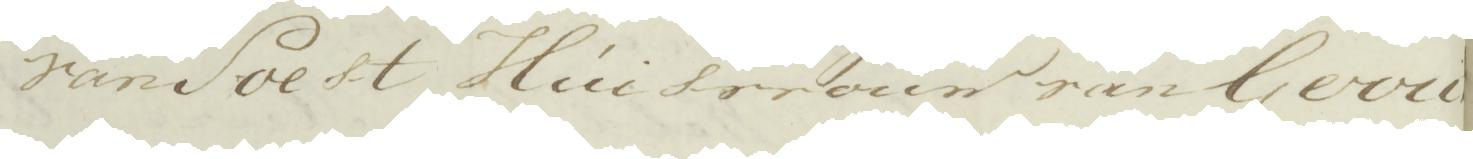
van Soest Huisvrouw van Gerri
